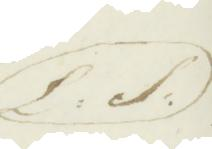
L:S:
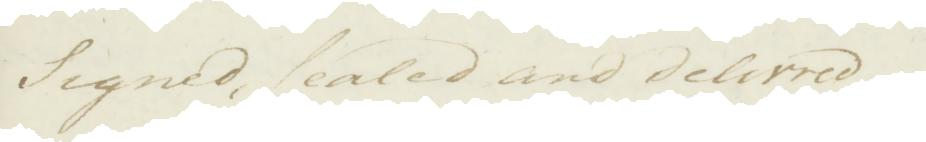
Signed, sealed and delivred
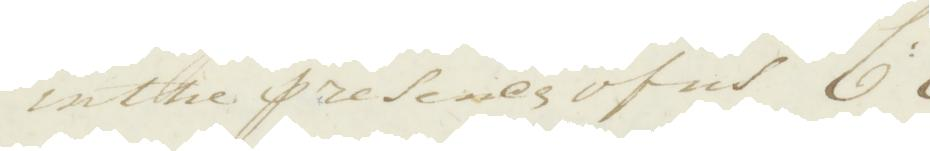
in the presence of us C:
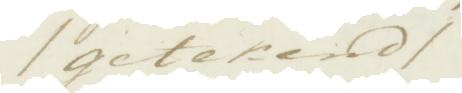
/ getekend/
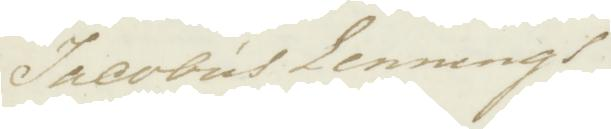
Jacobus Lennings
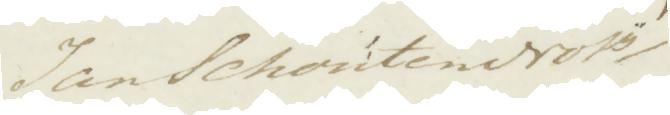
Jan Schoutens Not-ij
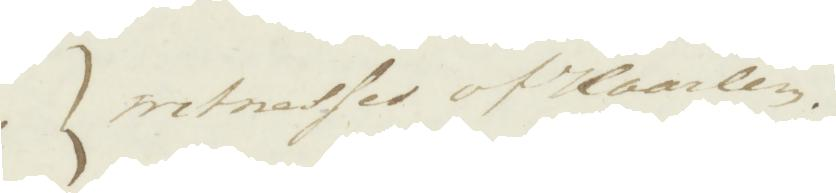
} witnesses of Haarlem.
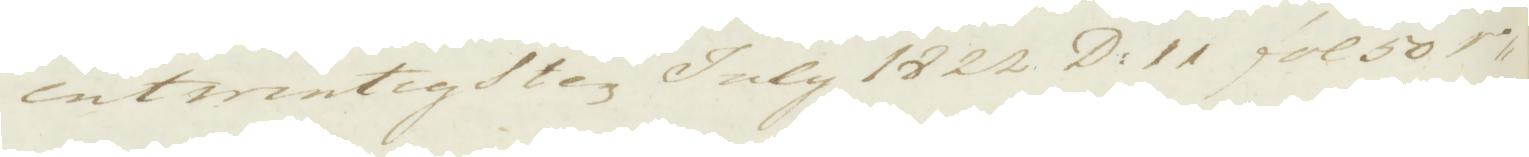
entwintigste July 1822 d: 11 fol 50 v„
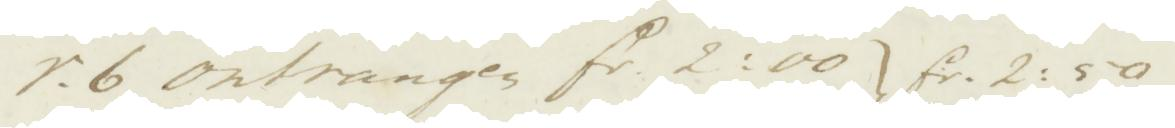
V.6 ontvangen fr. 2 : 00 fr. 2: 50
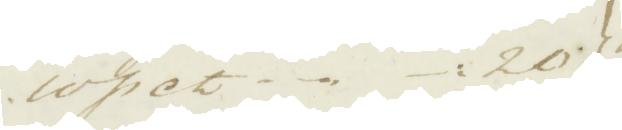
10 pct - „ —: 20
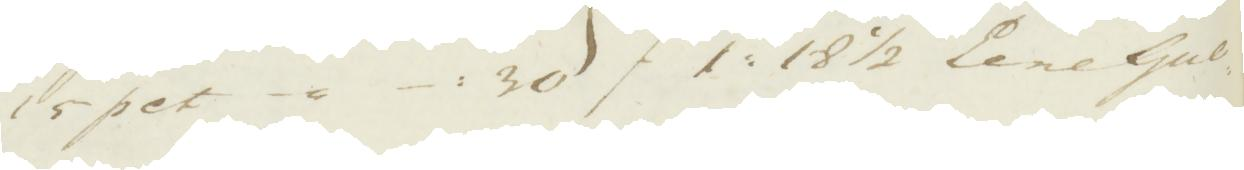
15 pct - „ —: 30 f 1:18½ Eene Gul
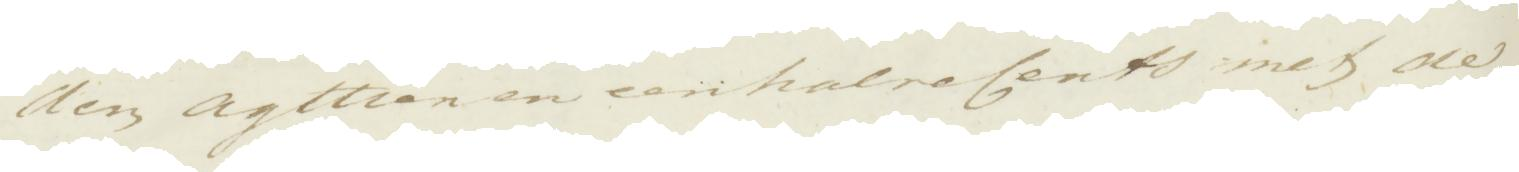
den agttien en een halve Cents met de
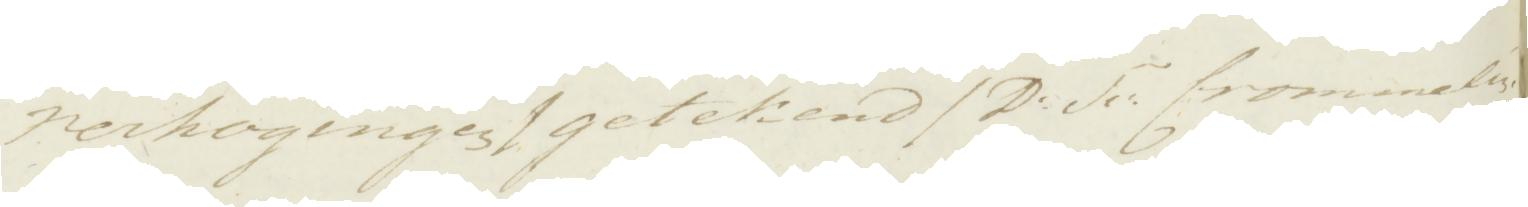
verhogingen /getekend/ D: F: Crommelin
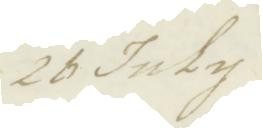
26 July
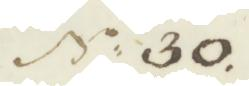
N: 30.
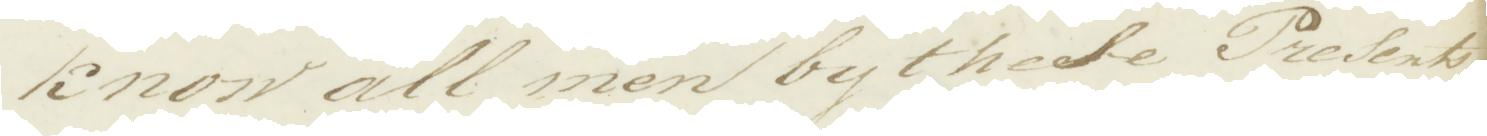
Know all men by these Presents
